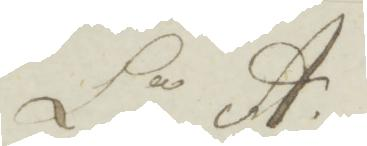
L„a A.
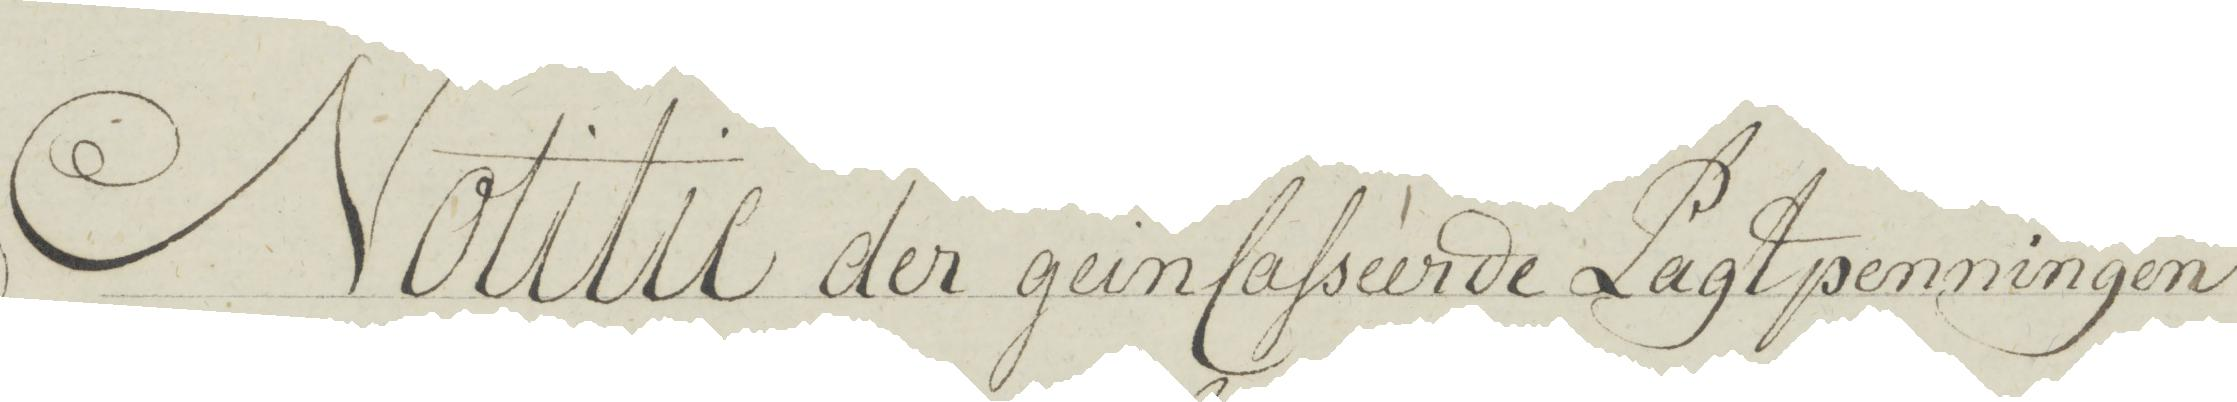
Notitie der geincasseerde Pagt penningen
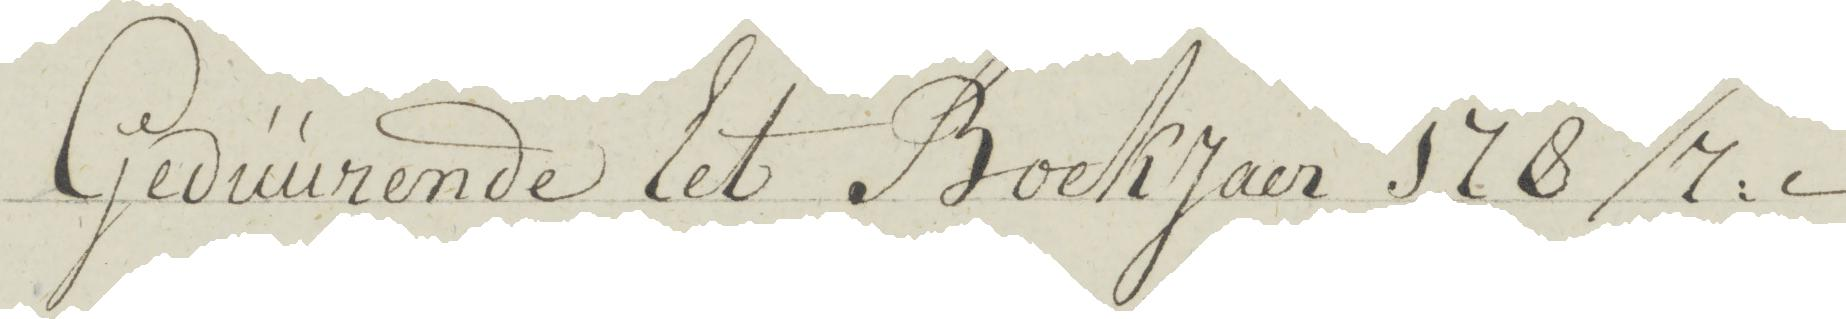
Geduurende het Boekjaer 1786/7:
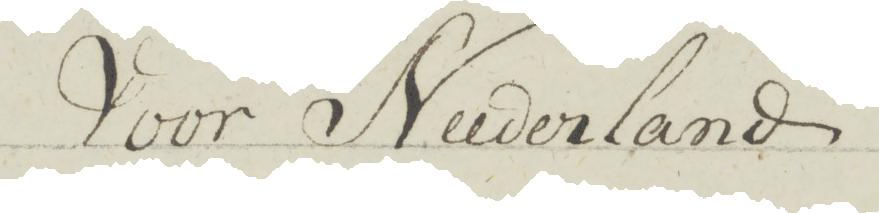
Voor Neederland
